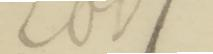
2017
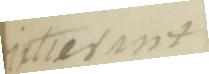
ntier in't
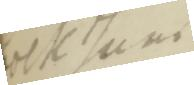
oek Jaar
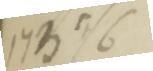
1735/6
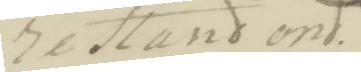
restand ond:
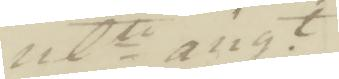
ul=to aug:t
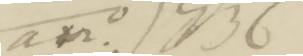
an.o 1736
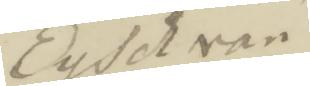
Eysch van
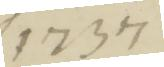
1737
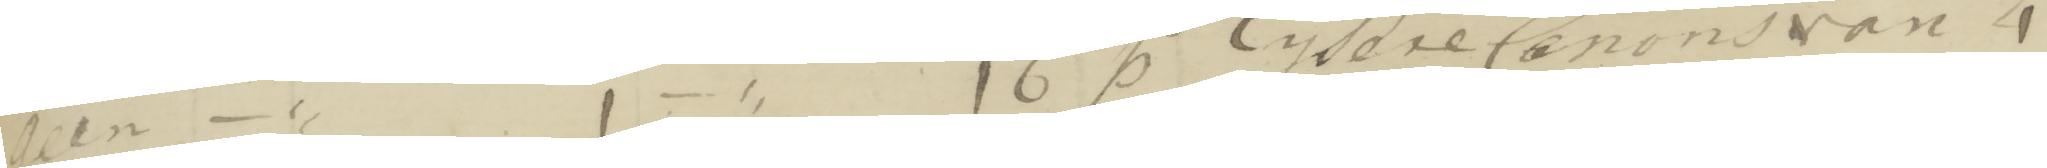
geen — „ 1 — „ 16 ps Eijsere Canons van 4
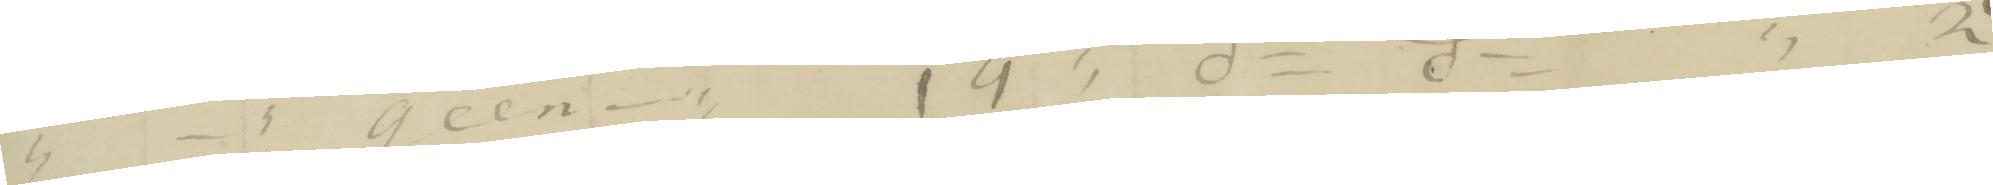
„ — „ geen — „ 14 „ d=o d=o „ 2
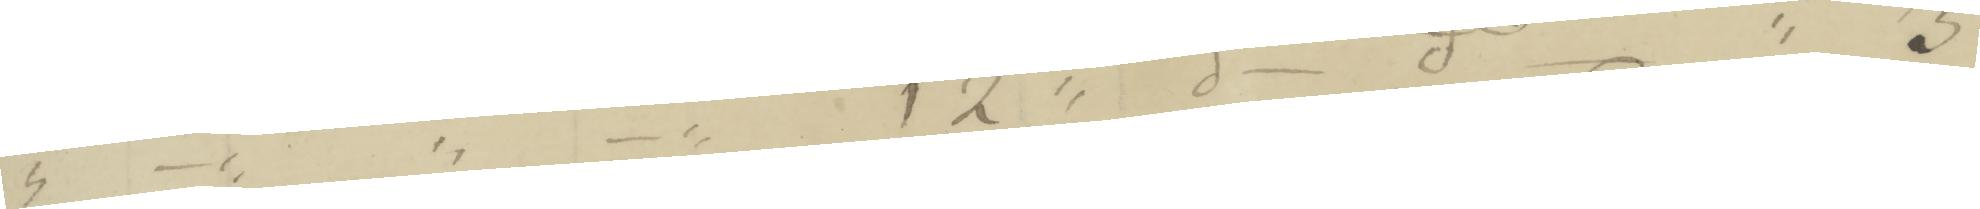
„ — „ „ — „ 12 „ d=o d=o „ 3
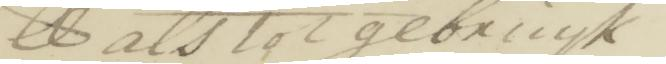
lb als tot gebruijk
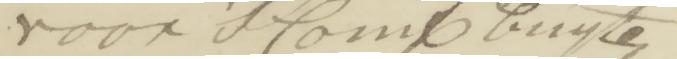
voor ’s Comp buyten
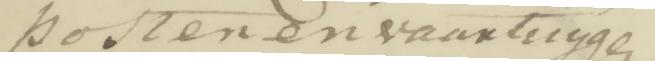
posten en vaartuygen
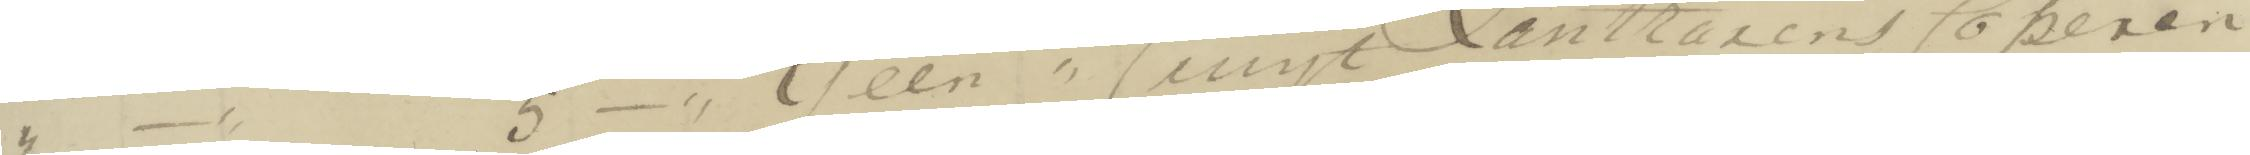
„ — „ 5 — „ Geen „ Cruyt Lantharens Coperen
